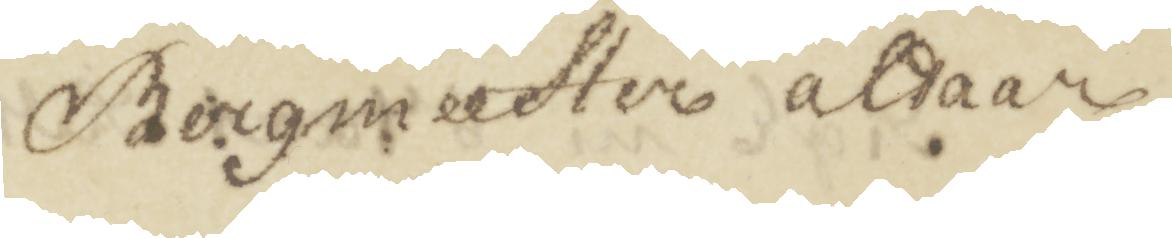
Bergmeester aldaar
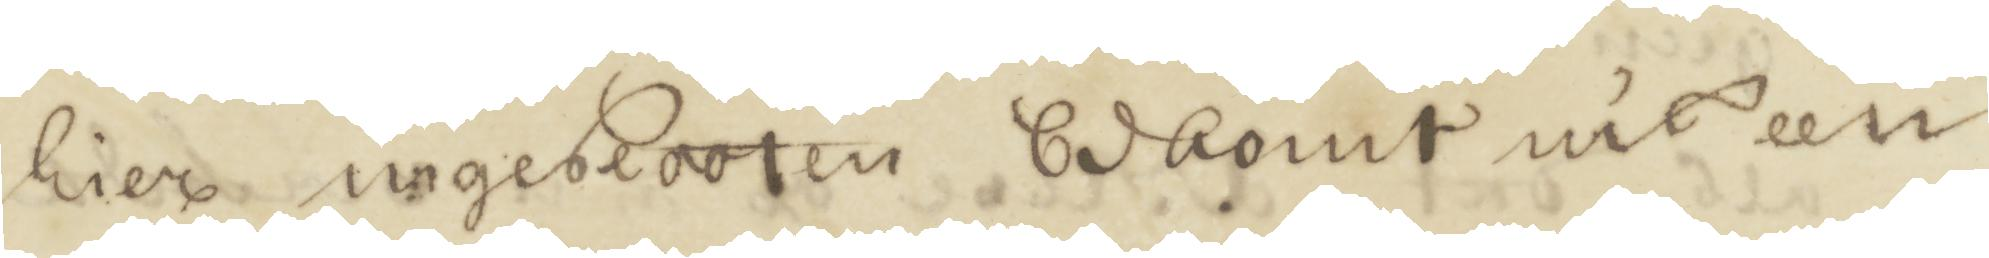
hier ingeslooten bekomt uE een
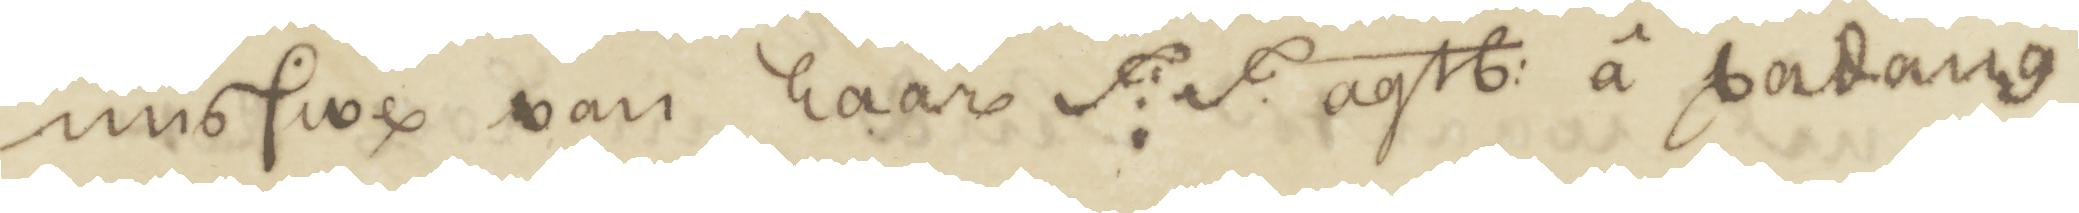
missive van haar E: E. agtb: â padang
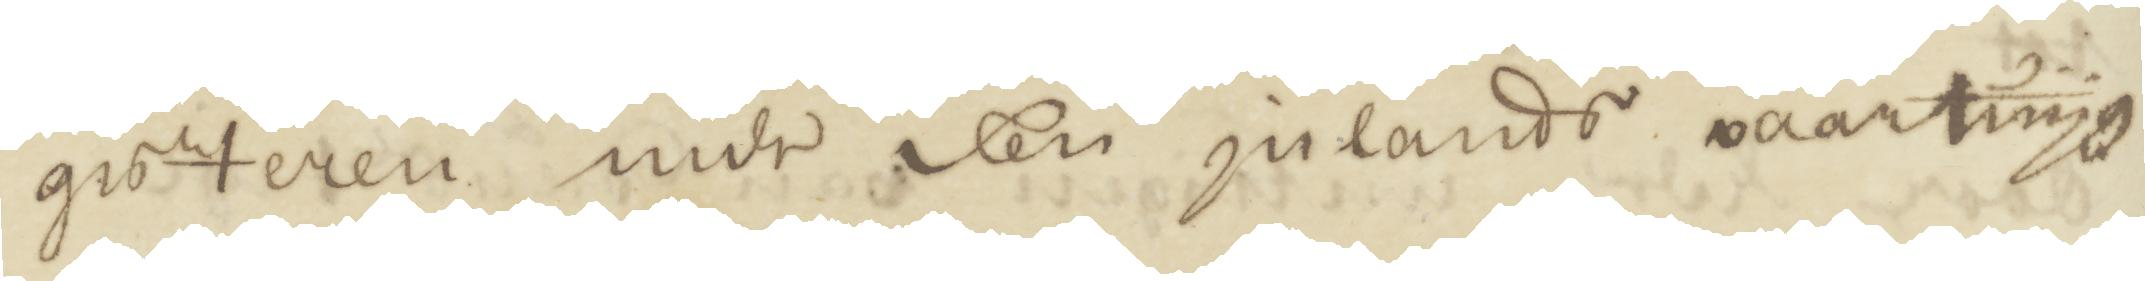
gisteren met Een jnlands vaartuijg
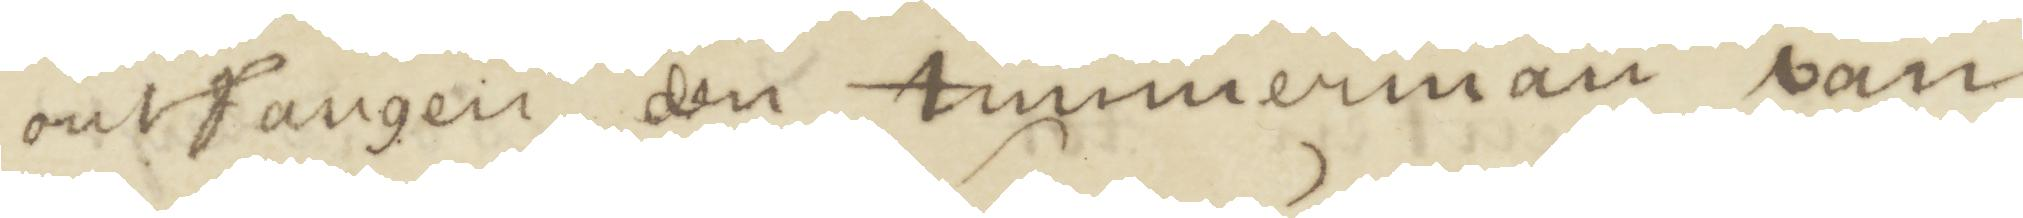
ontfangen den timmerman van
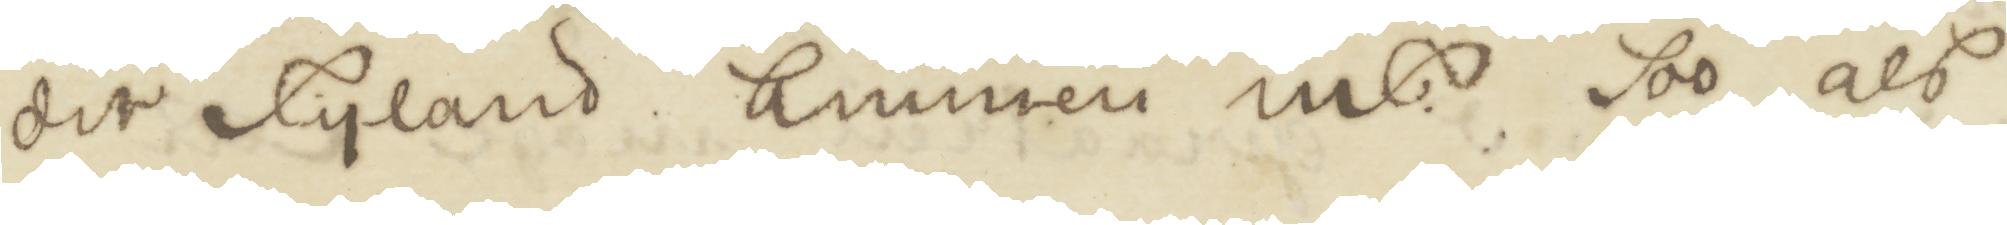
dit Eijland. kunnen uE. Soo als
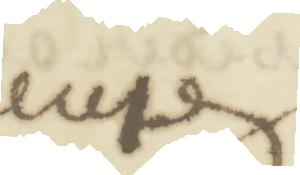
leten
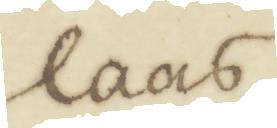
laas
